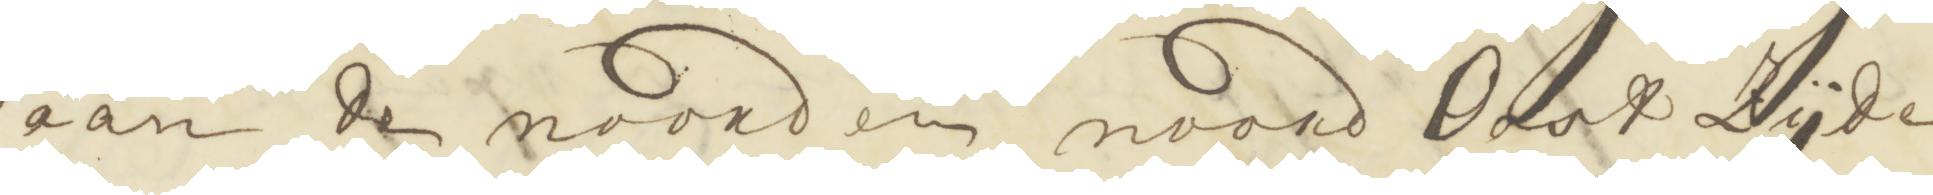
aan de noord en noord Oost zijde
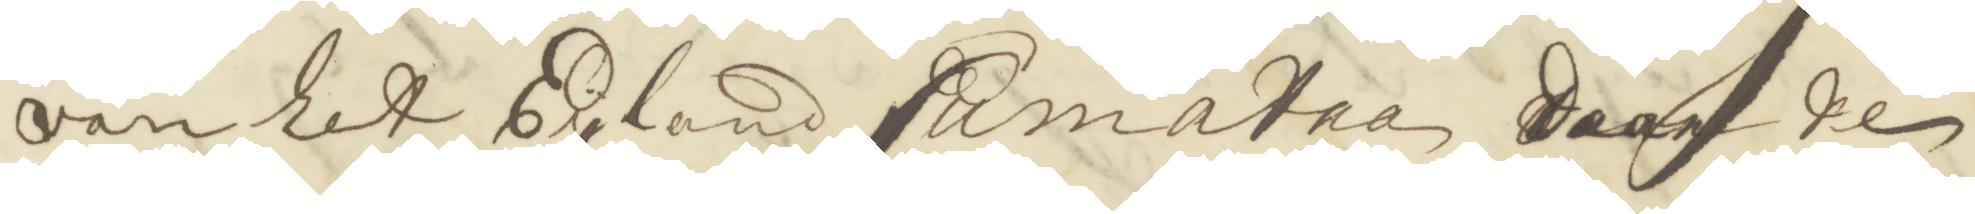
van het Eijland Sumatra daar de
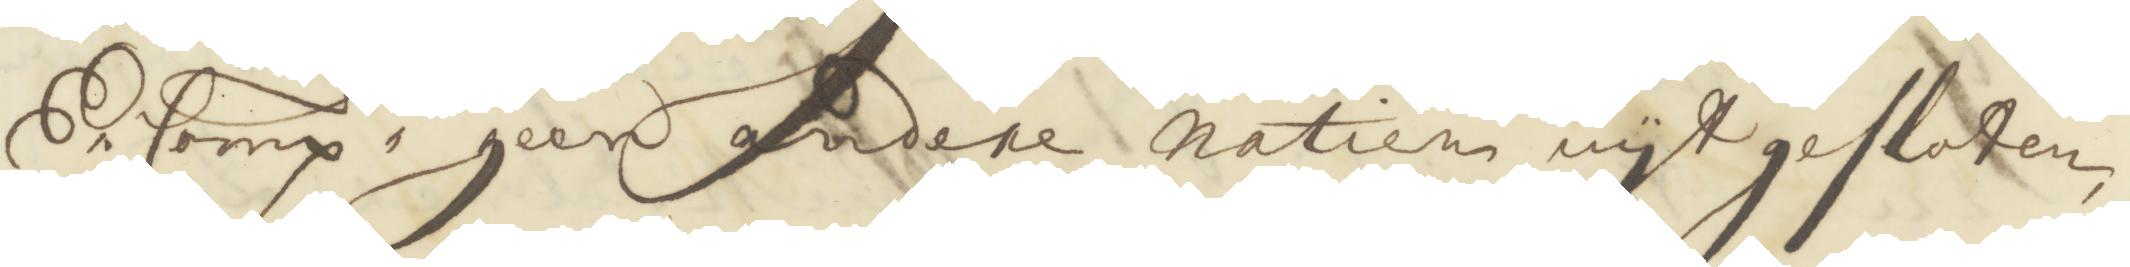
E„ Comp„e geen andere natien uijt gesloten,
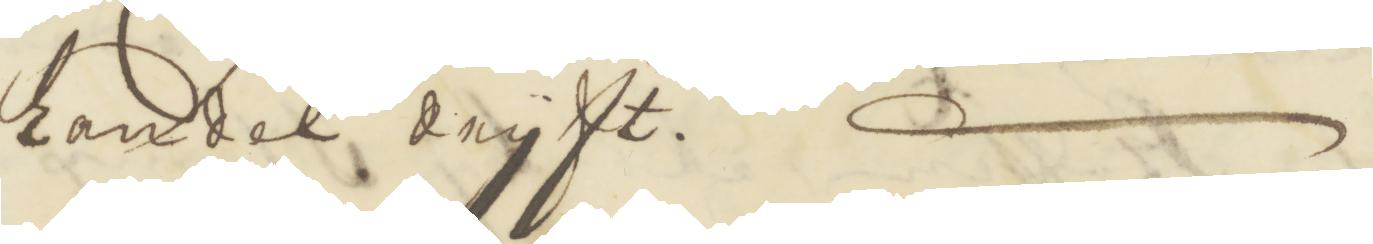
handel drijft. —
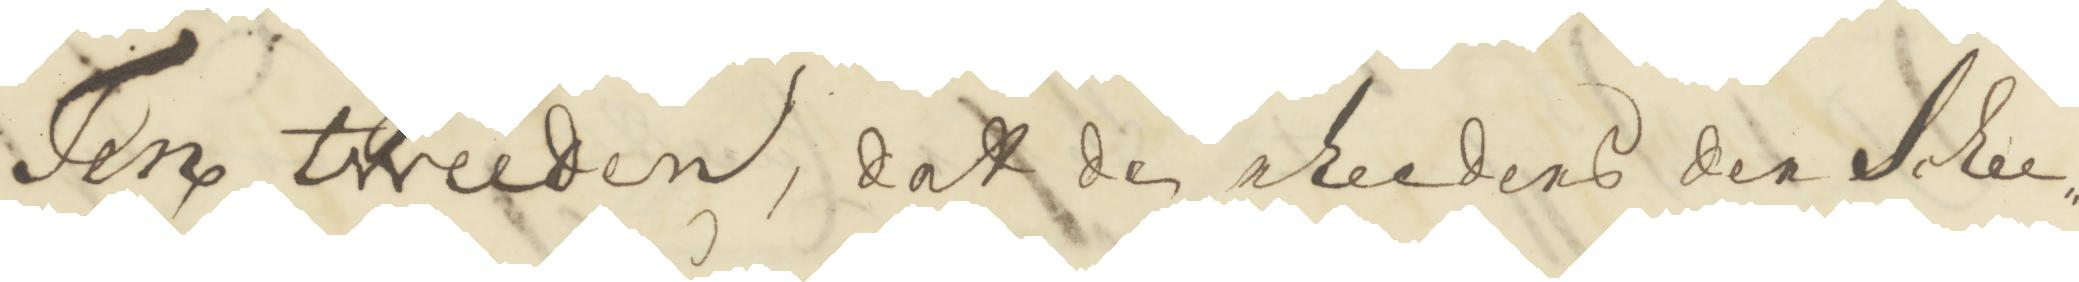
Ten tweeden, dat de rheeders der schee„
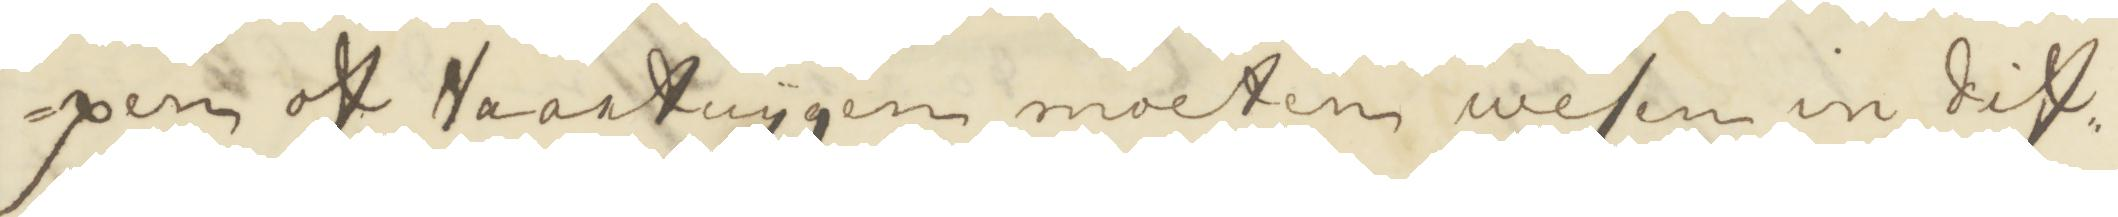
„pen of Vaartuijgen moeten wesen in dif„
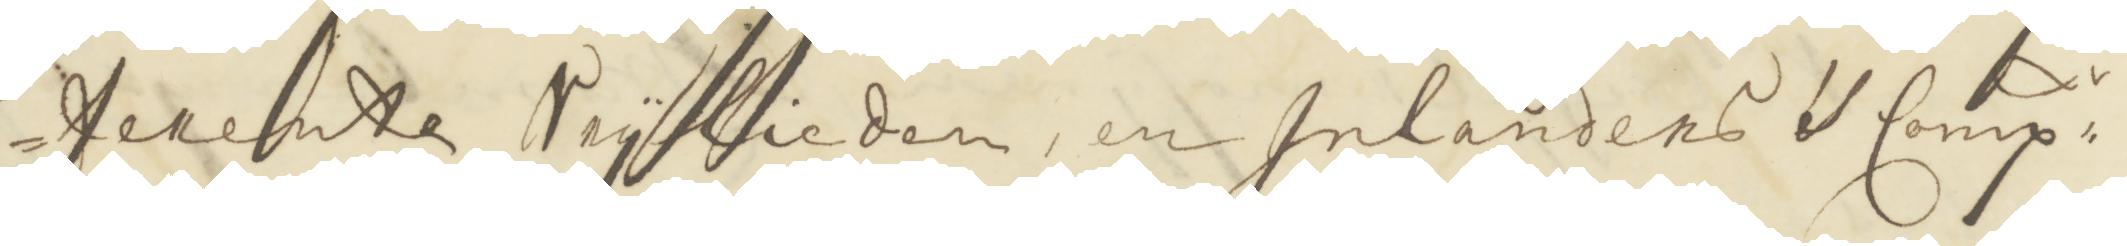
„ferente Vrijlieden, en Jnlanders 's Comp„e
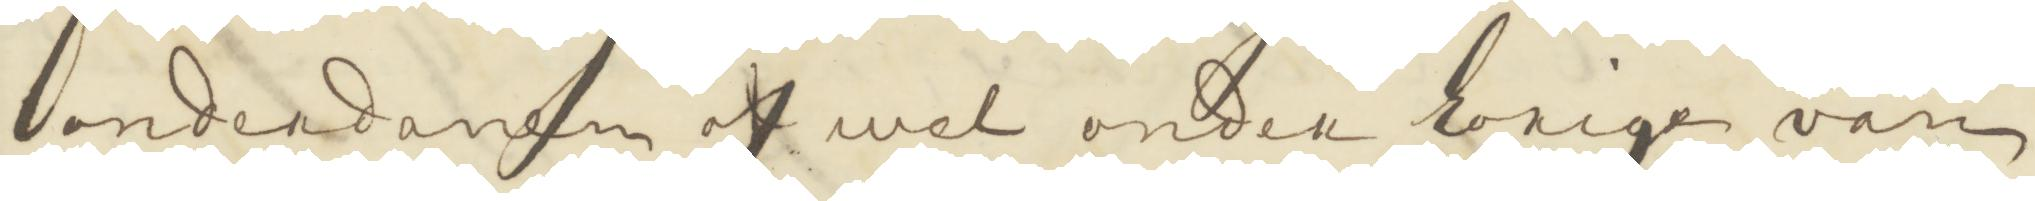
onderdanen of wel onder horige van
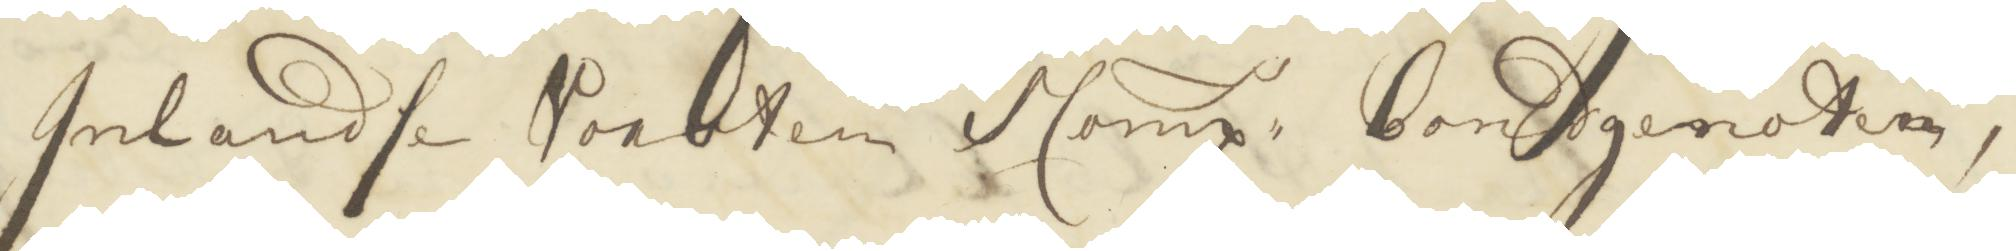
Jnlandse Vorsten 'sComp:' bondgenoten,
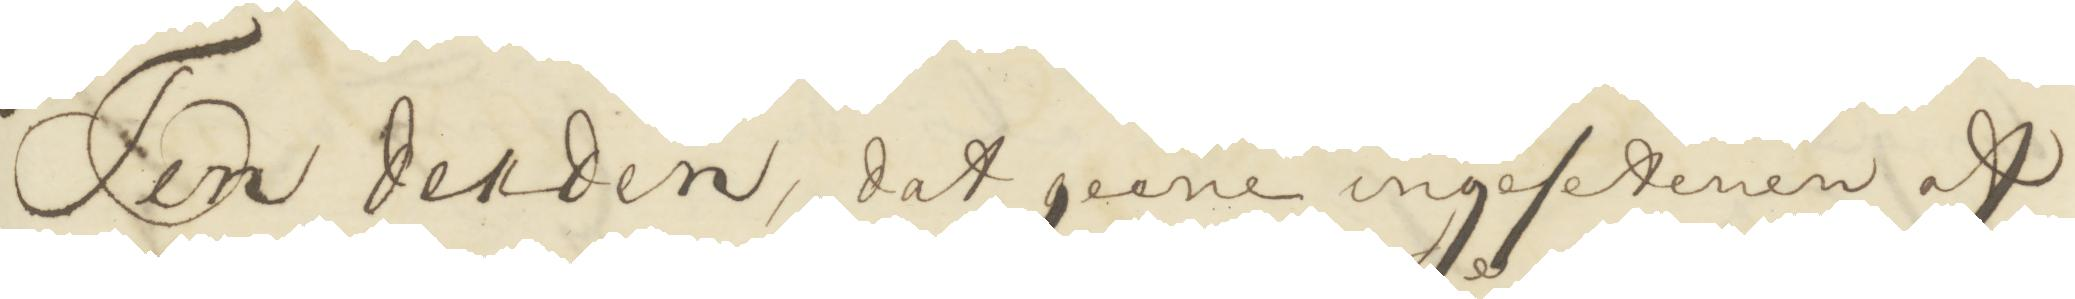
Ten derden, dat geene ingesetenen of
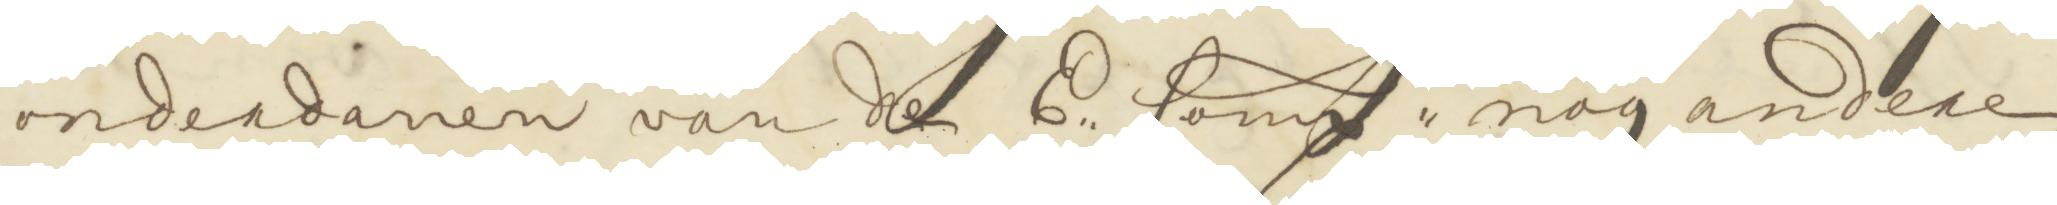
onderdanen van de E„ Comp„e nog andere
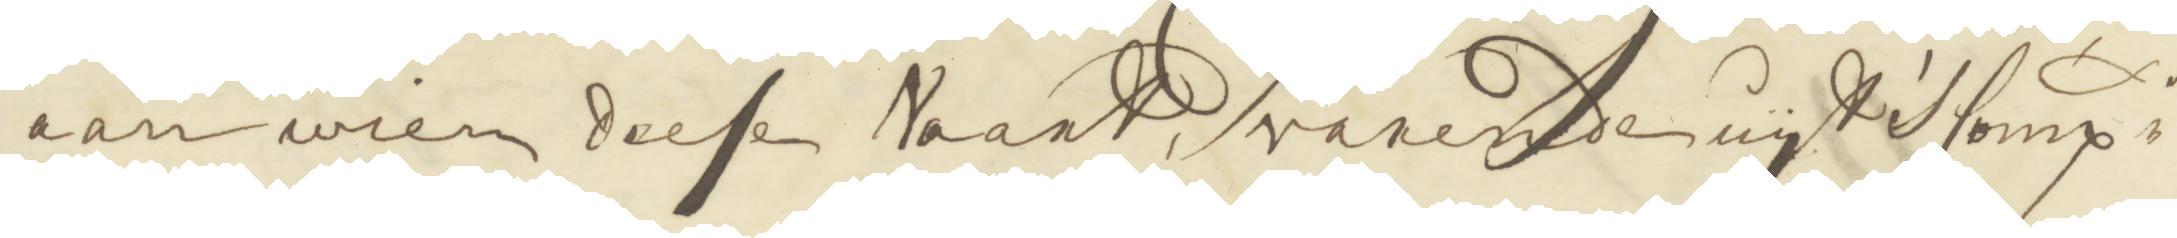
aan wien deese Vaart, varende uijt 's Comp:'s
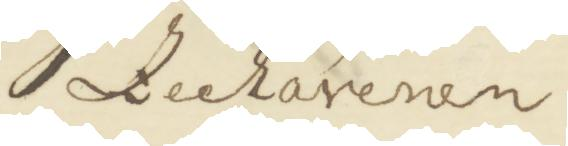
Zeehavenen
